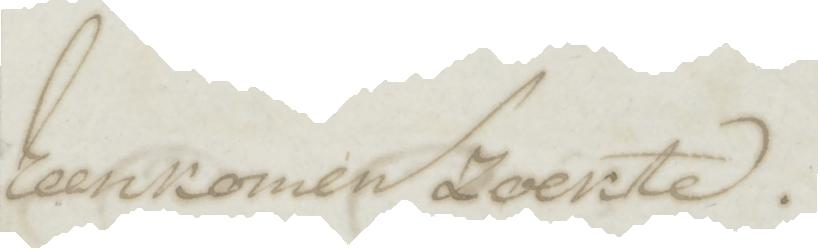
heenkomen zoekte.
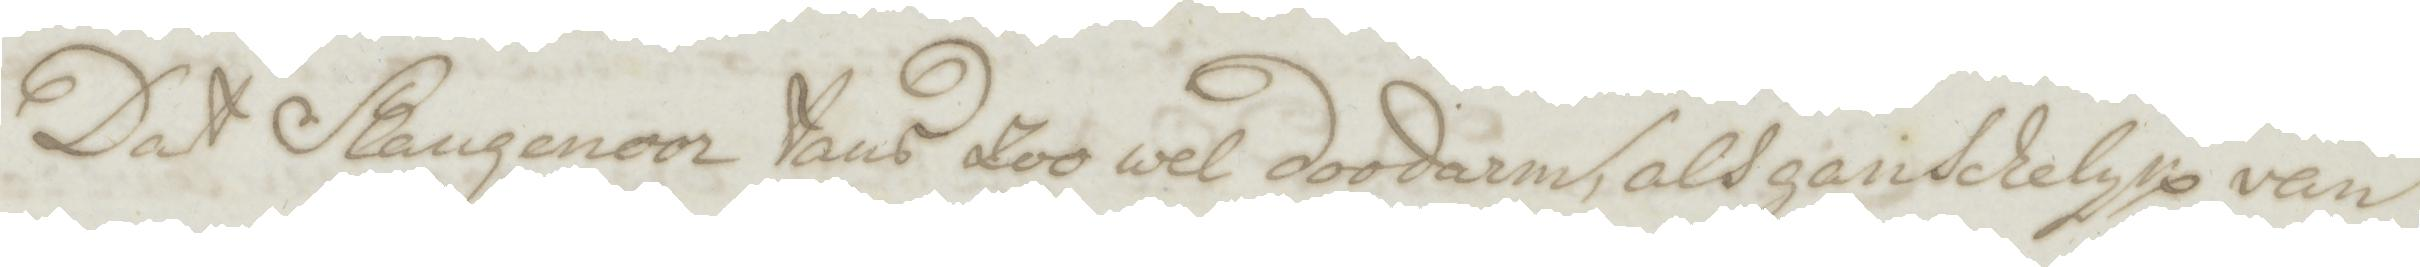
Dat Slangenoor tans zoo wel doodarm, als ganschelyk van
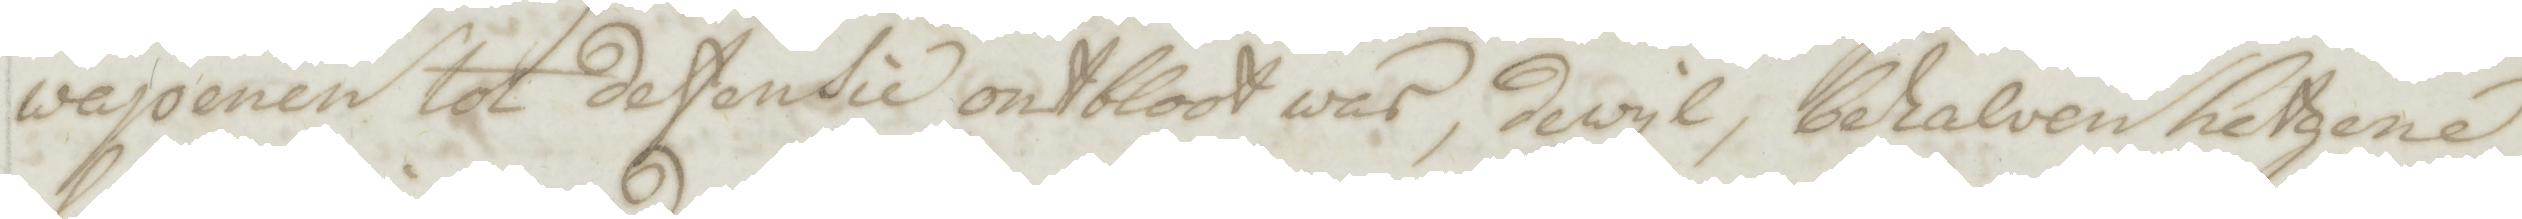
wapenen tot defensie ontbloot was, dewijl, behalven hetgene
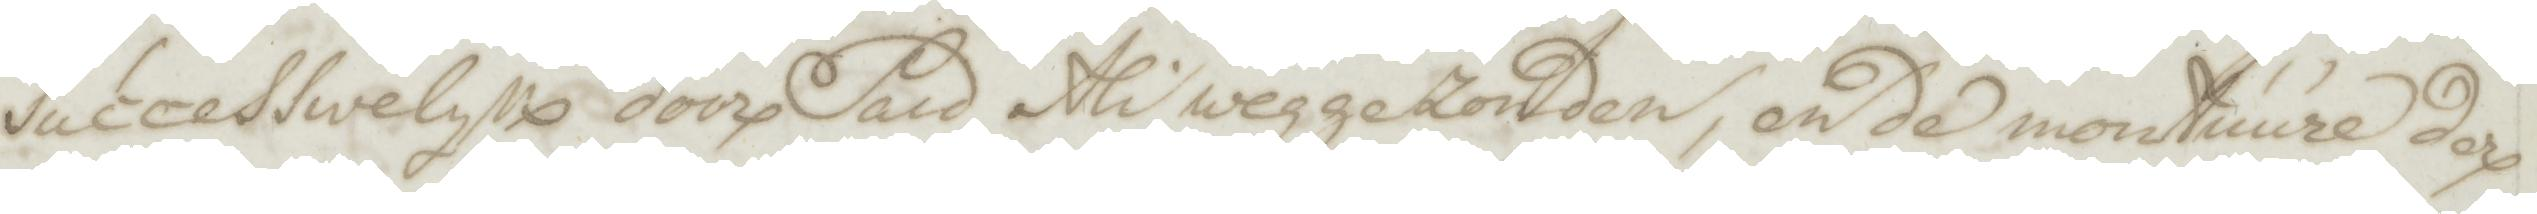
successivelyk door Said Ali weggezonden, on de montuure der
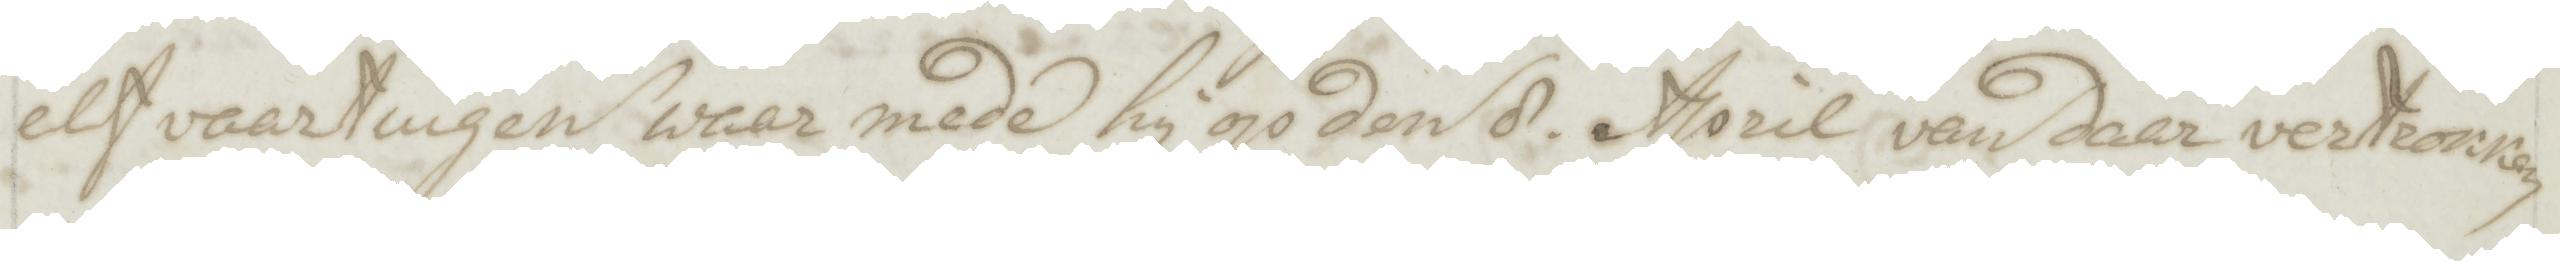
elf vaartuigen waar mede hij op den 8. April van daar vertrokken
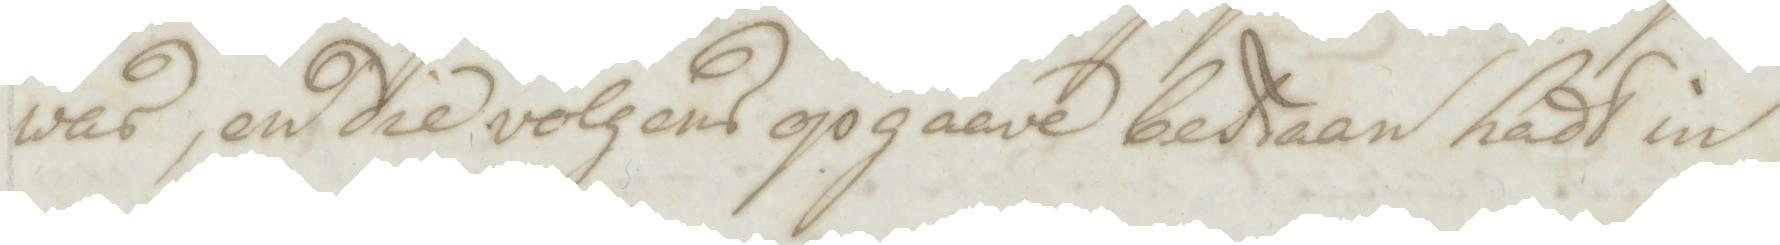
was, en die volgens opgaave bestaan hadt in
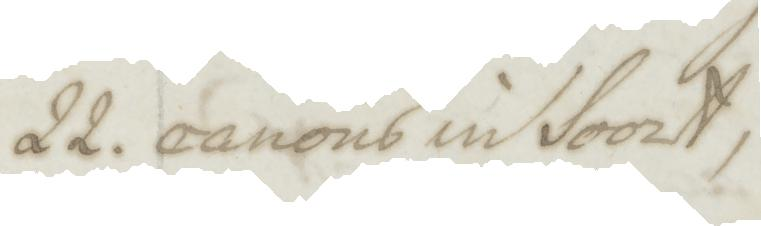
22. canons in soort,
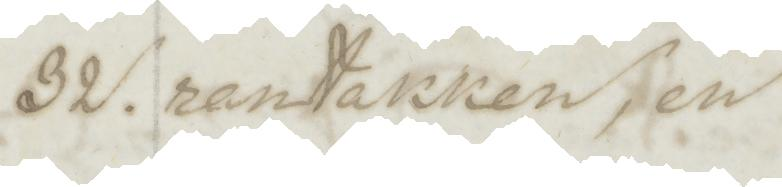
32. rantakken, en
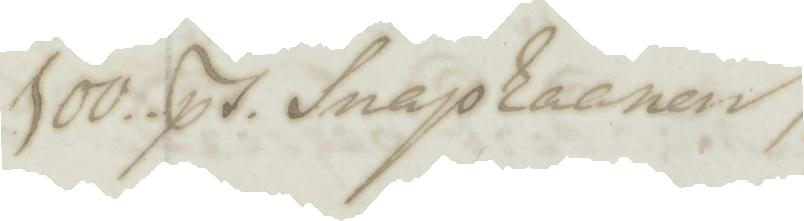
100. p.s Snaphaanen,
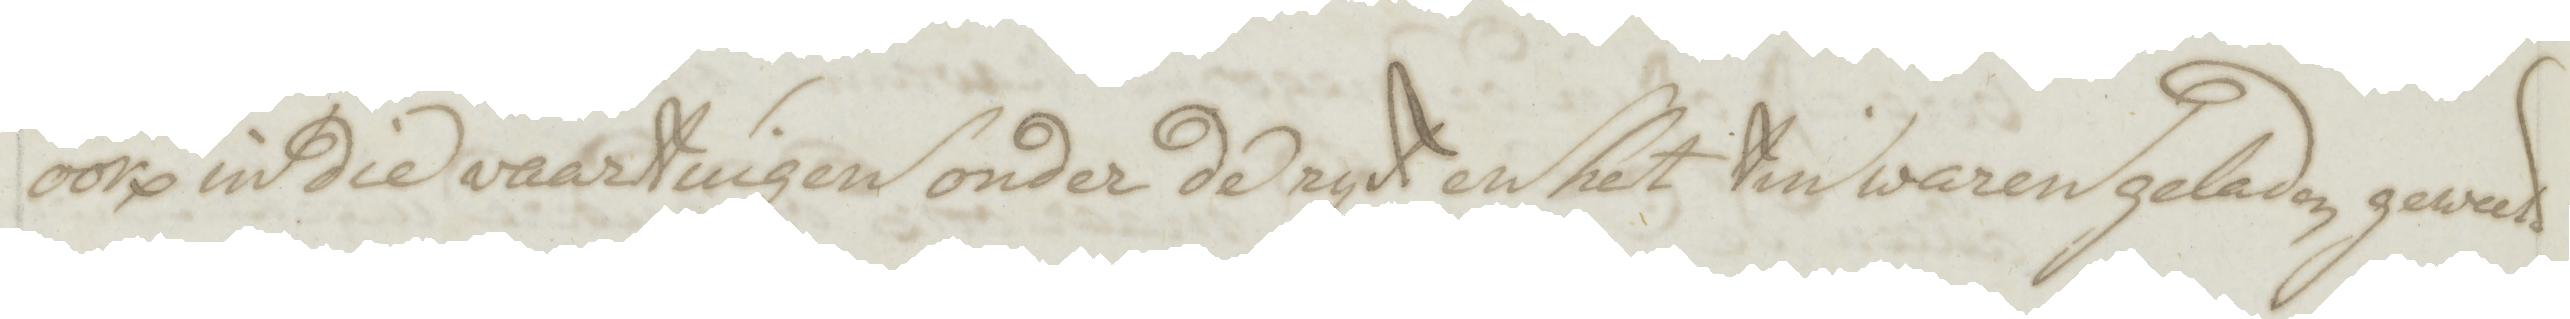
ook in die vaartuigen onder de ryst en het tin waren geladen geweest
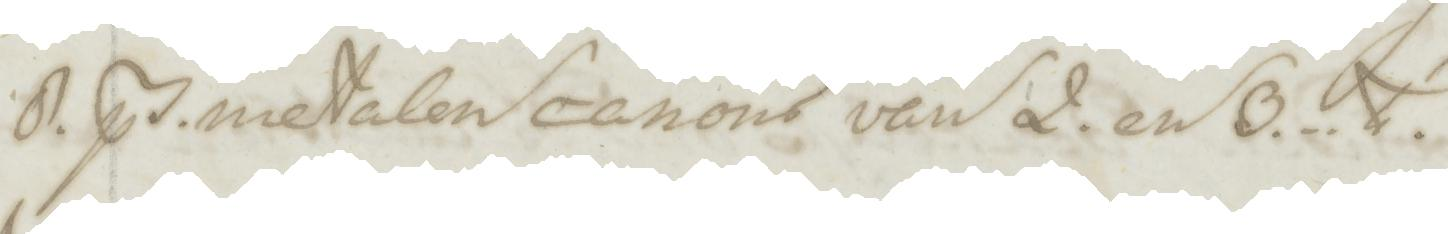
8. p.s metalen canons van 2. en 3.— „
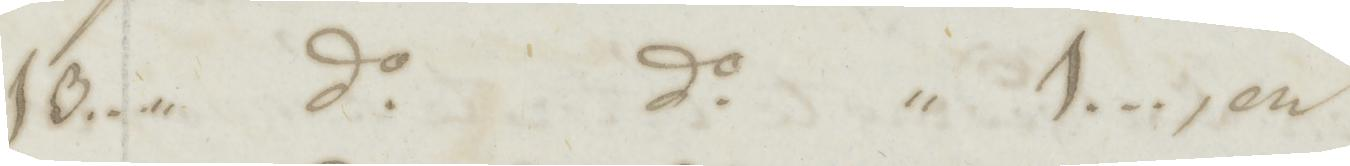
13.-„ d.o d.o „ 1..., en
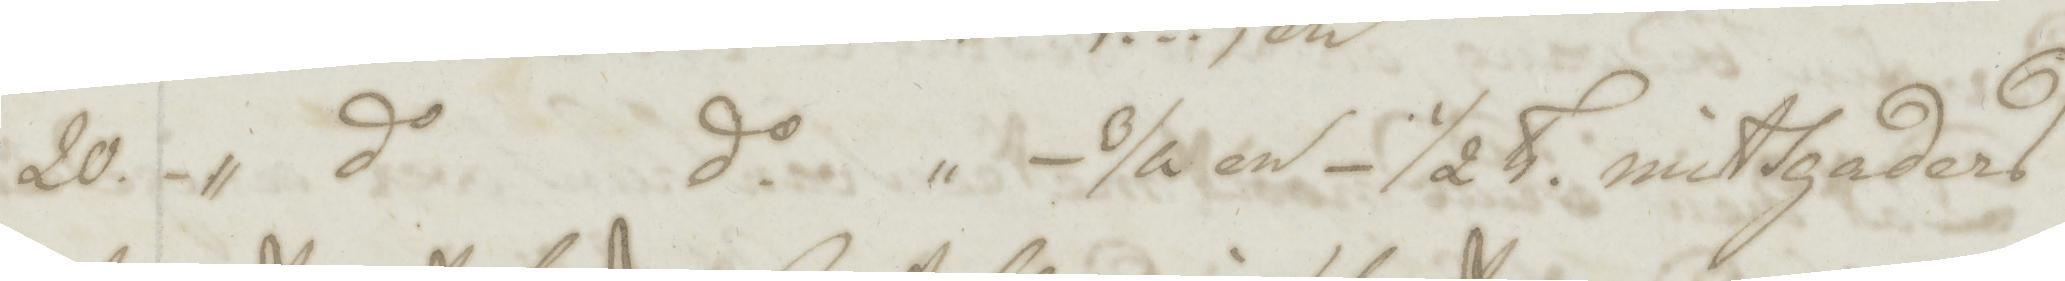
20. „ do do „ — ¾ en — ½ T. mistgaders
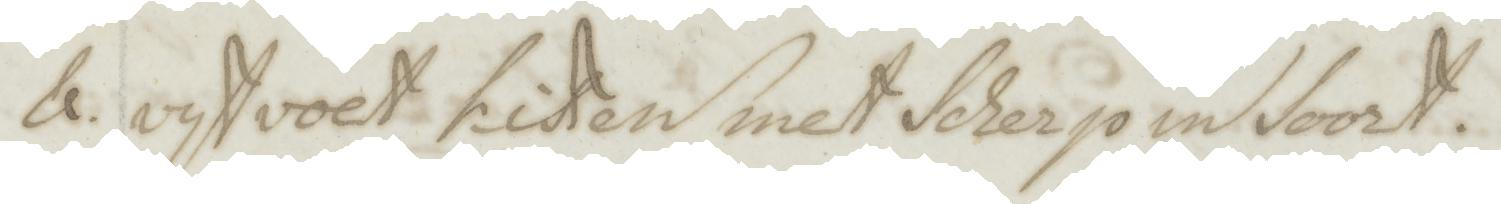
4. vyt voek kisten met scherp in soort.
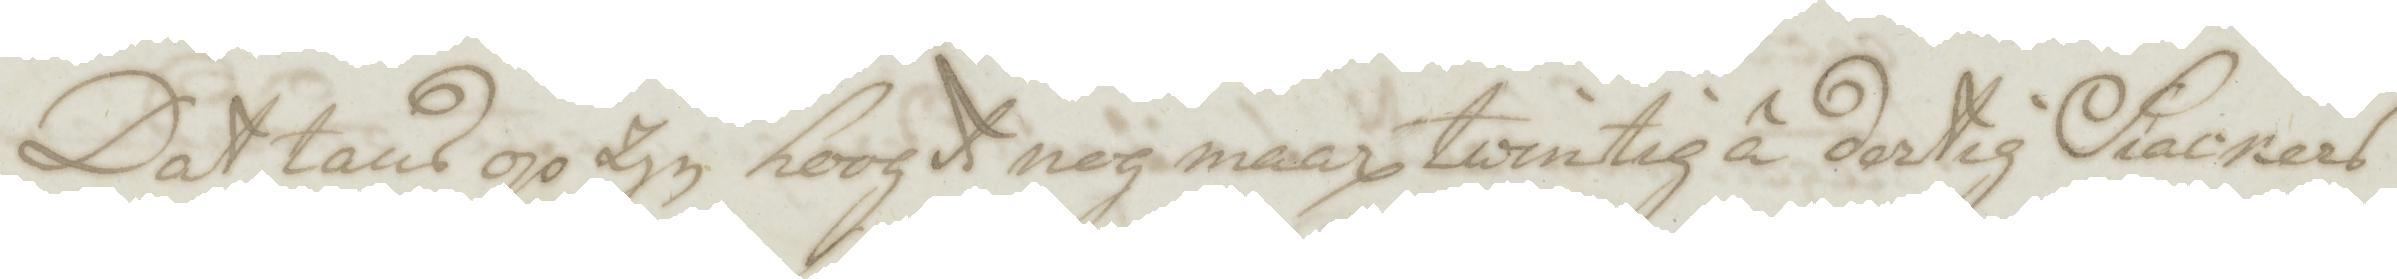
Dat tans op zyn hoogst nog maar twintig â dertig Siackers
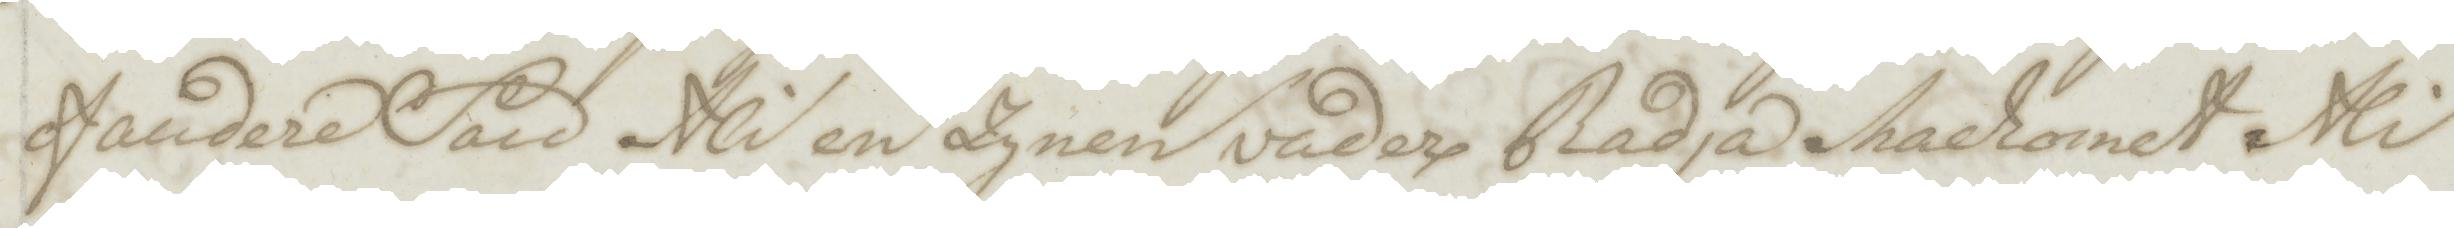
of andere Said Ali en zynen vader Radja Maehomet Ali
